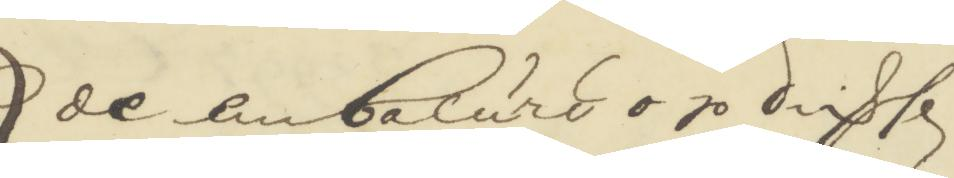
de embalure op diverse
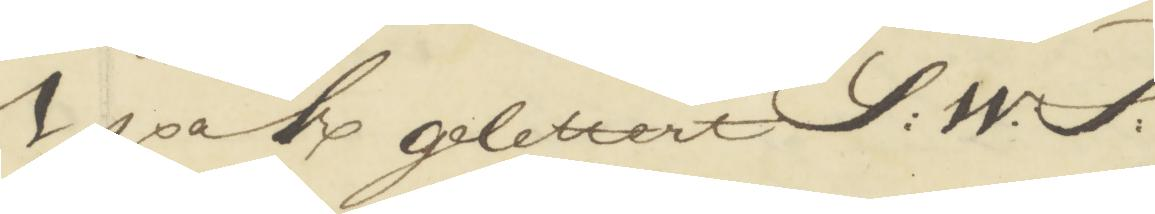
1 pak gelettert S: W:S:}
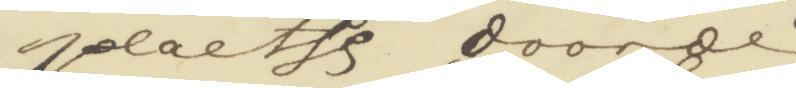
plaetse door de
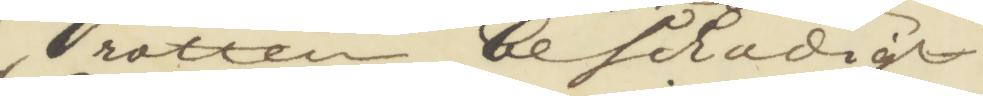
„ratten beschadigt
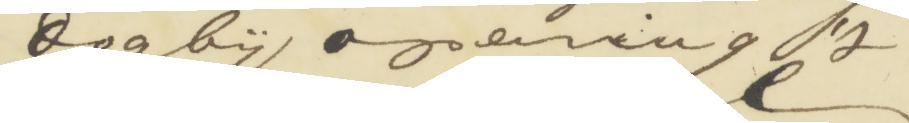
dog bij opening 't
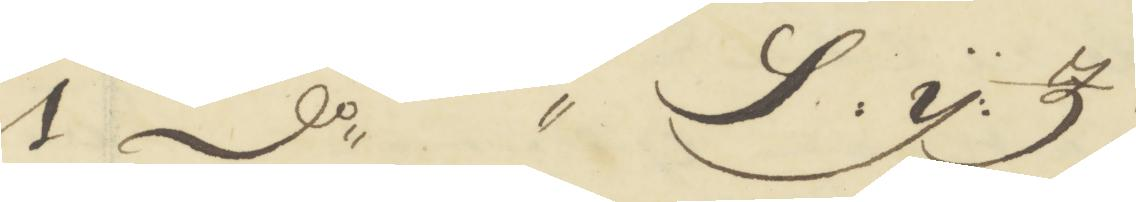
1 d„o „ S: ij: Z: }
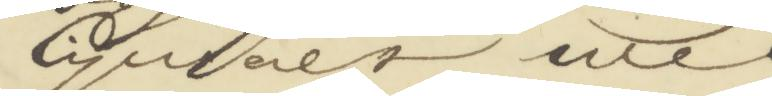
lijnwaet wel
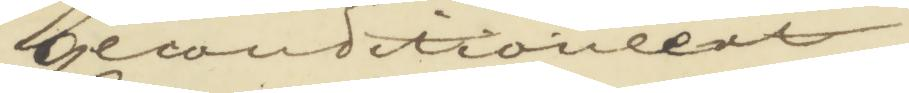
geconditioneert
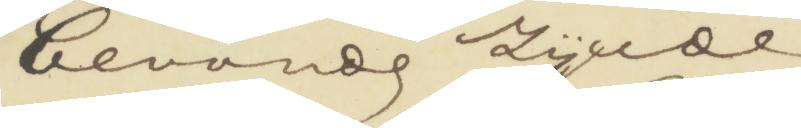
bevonden Zijnde
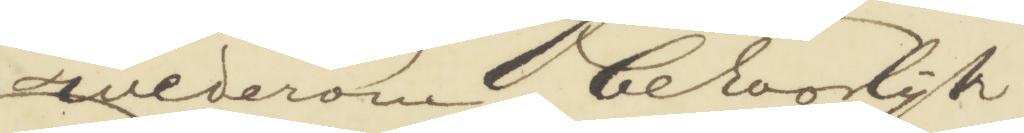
wederom behoorlijk
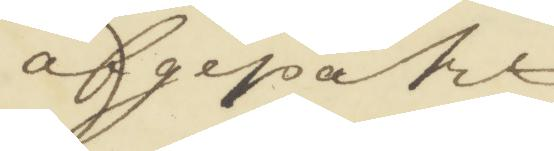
afgepakt
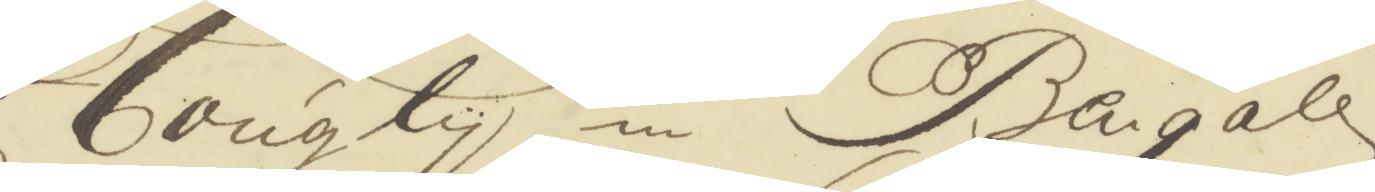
/: onder stond / Houglij in Bengalen
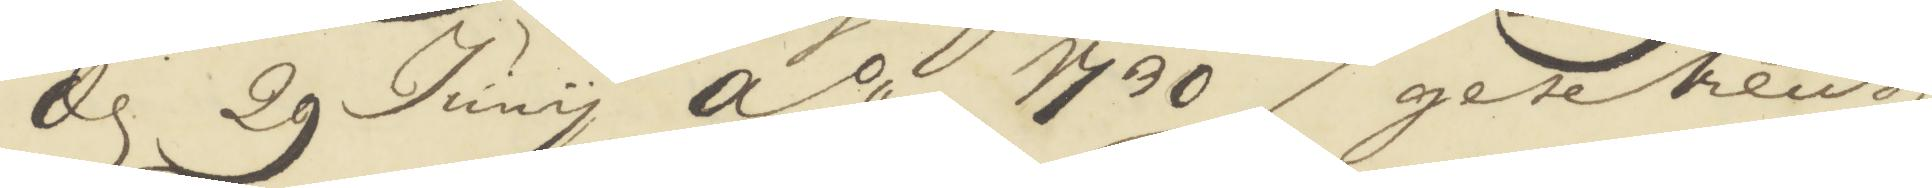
den 29 Iunij a„o 1730 / getekent /
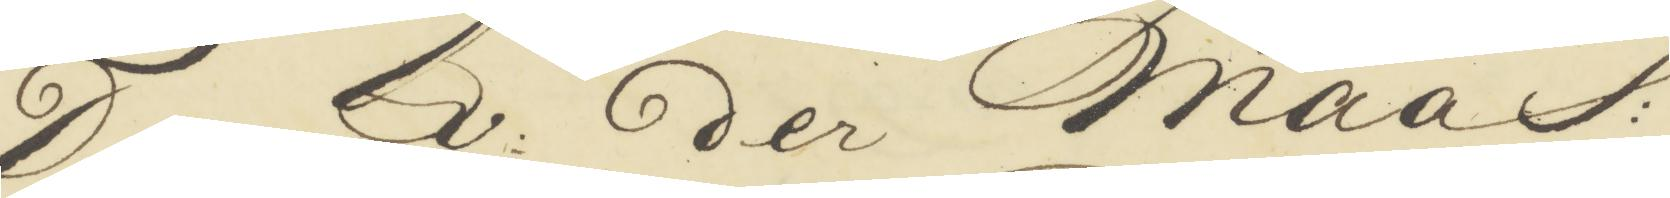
D: v: der Maas:
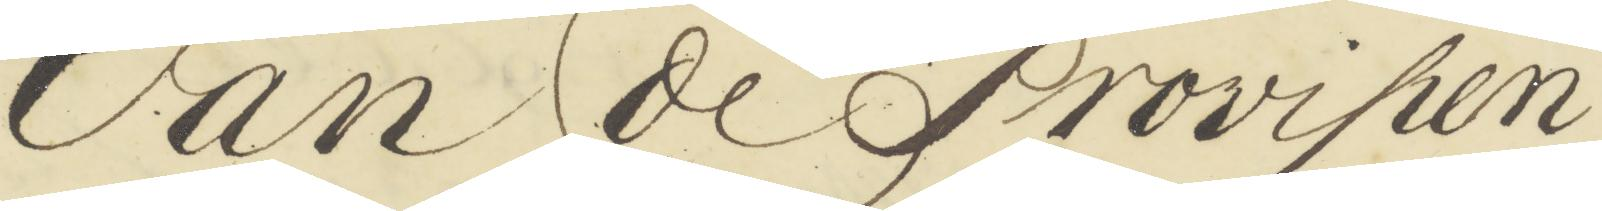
Van de Provisien
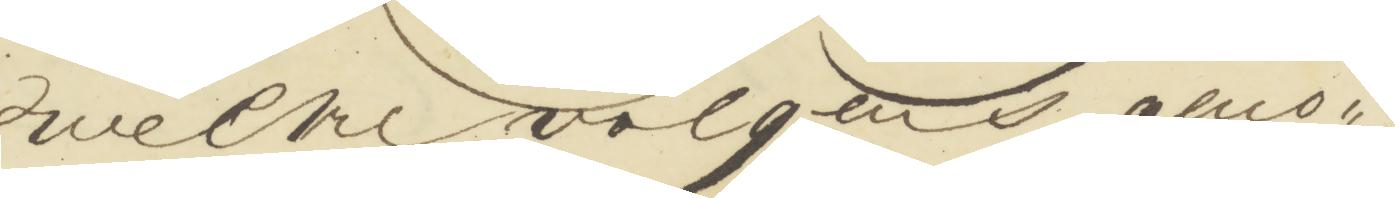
welke volgens geno„
